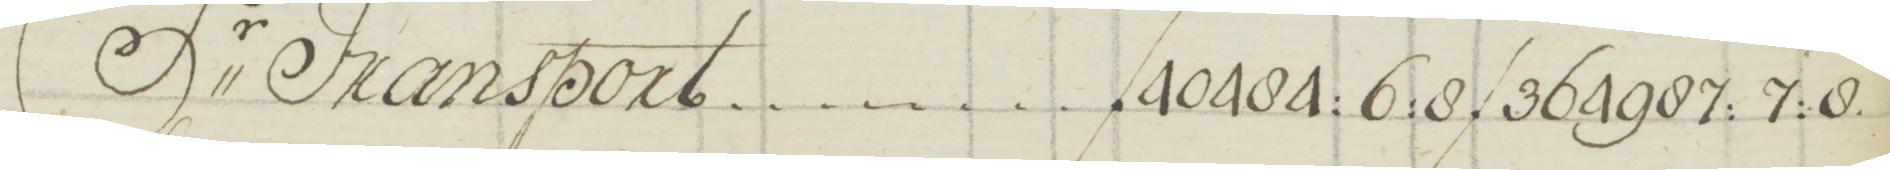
P„r Transport . . . . . . . . ƒ40484: 6: 8ƒ364987: 7: 8.
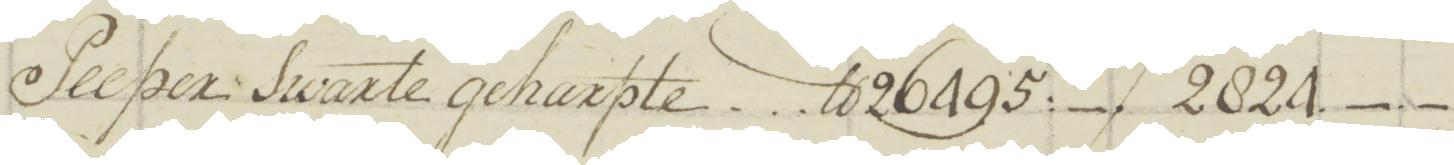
Peeper swarte geharpte . . . lb26495: –ƒ 2824. –.–
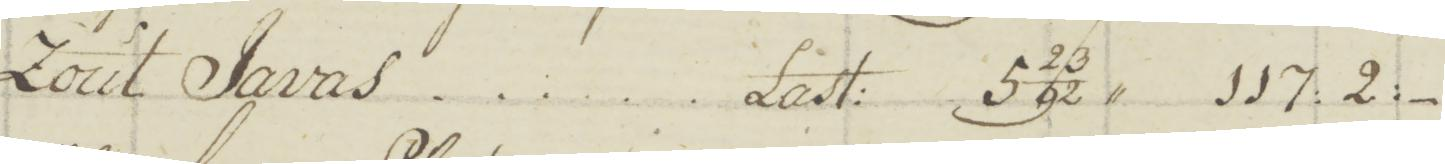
Zout Iavas . . . . . . Last: 5 23/92 „ 117: 2:–
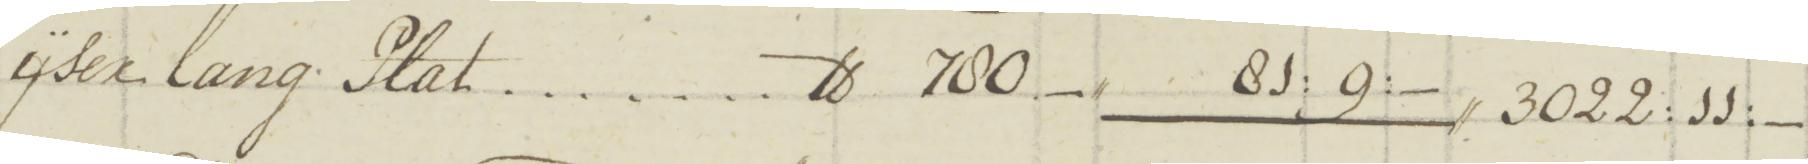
ijser lang Plat . . . . . . . lb 780.–„ 81: 9:– „ 3022: 11: –
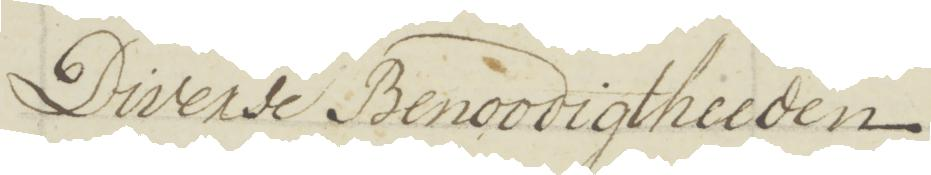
Diverse Benoodigtheeden
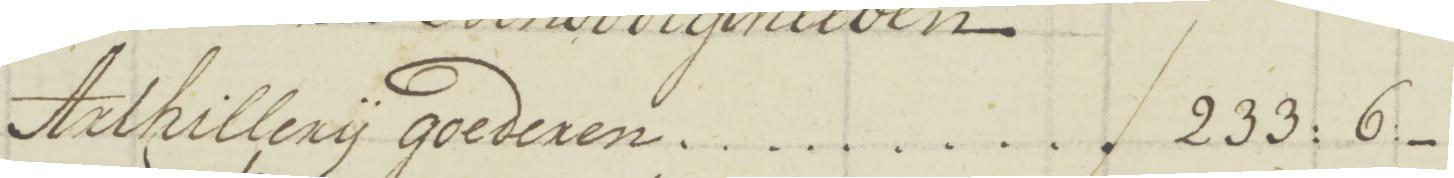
Arthillerij goederen . . . . . . . . . ƒ 233: 6: –
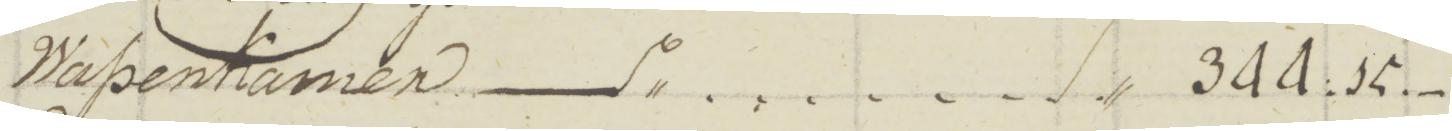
Wapenkamer _„o . . . . - - . .„ 344: 15.–
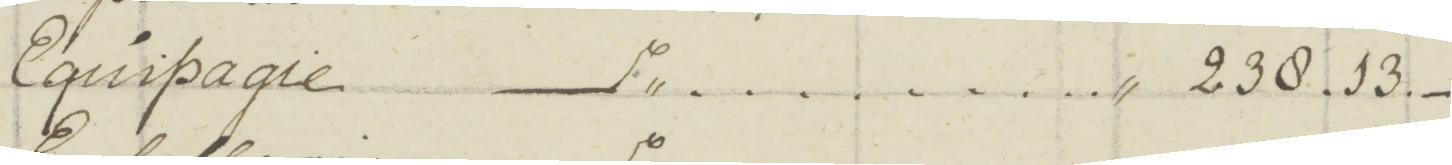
Equipagie _„o . . . . - - . . . „ 238. 13.–
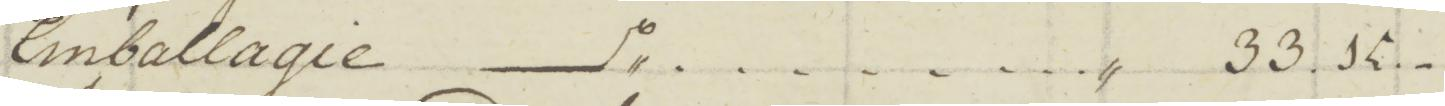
Emballagie _„o . . . . - - . . „ 33.15.–
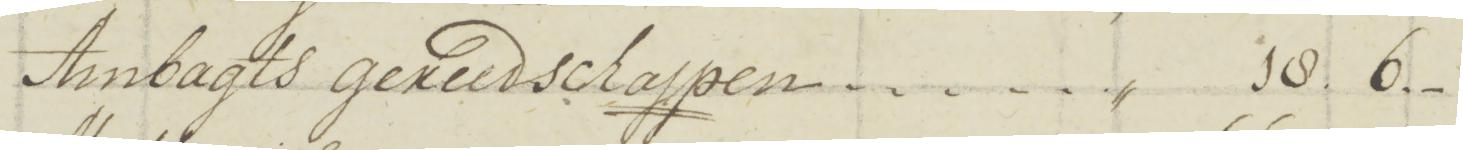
Ambagts gereedschappen . . . . . . „ 18. 6.–
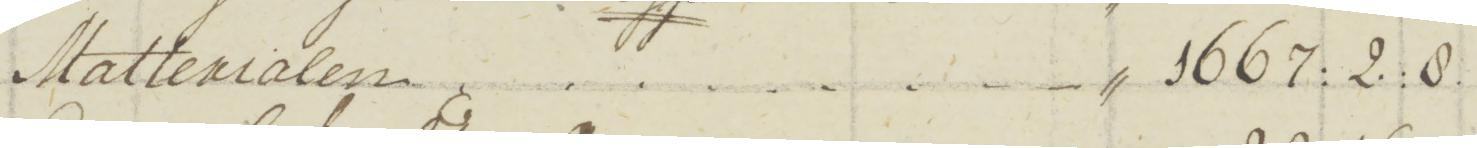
Matterialen . . . . . - . - - „ 1667: 2: 8.
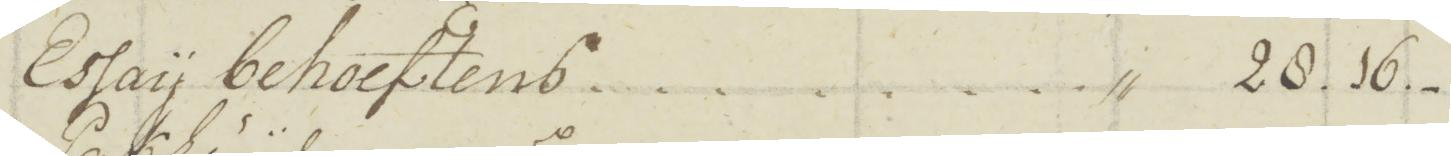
Essaij behoeftens . . . . . . . . „ 28. 16.–
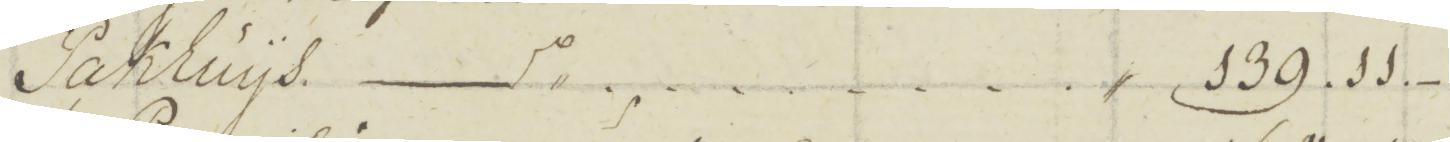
Pakhuijs. _„o . . . . - - - . „ 139.11.–
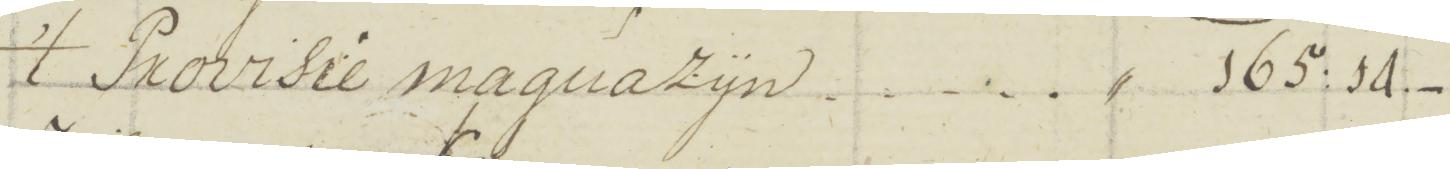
’t Provisie maguazijn . - - . „ 165:14.–
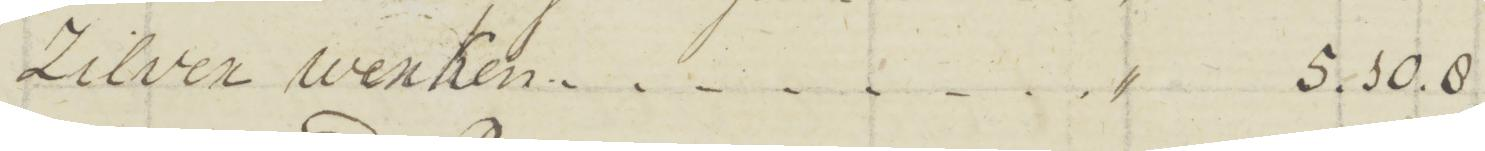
zilver werken - - – - - – . . „ 5. 10. 8
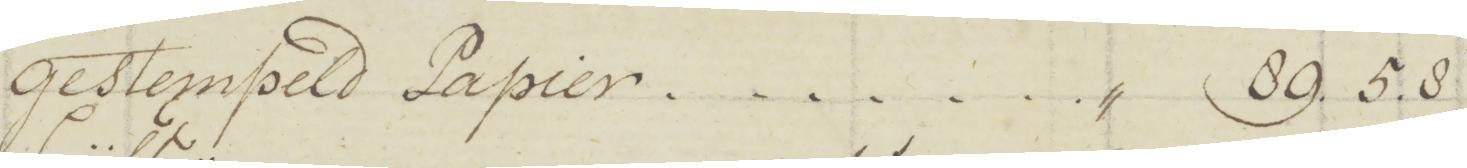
gestempeld Papier . - - - - . . „ 89. 5. 8
